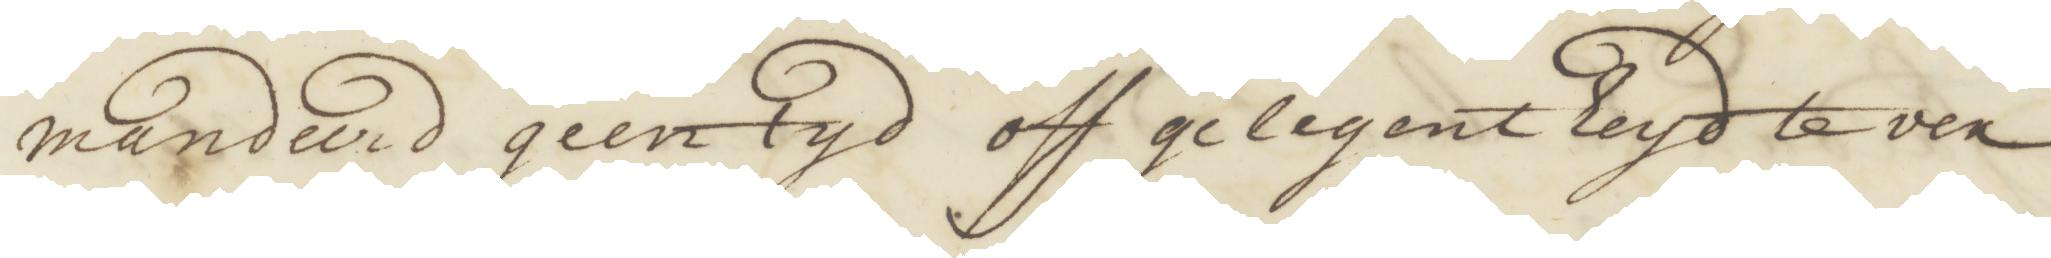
mandeerd geen tyd off gelegentheyd te ver
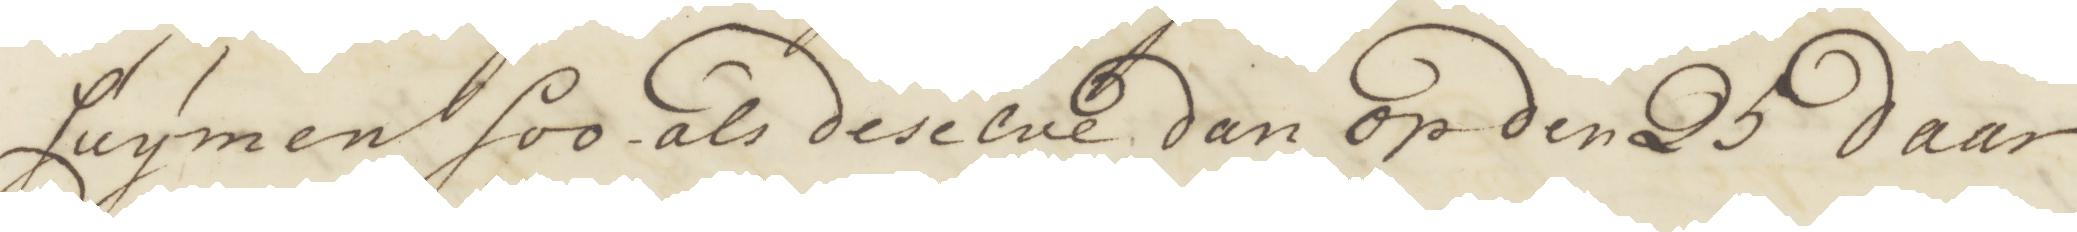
suymen soo als deselve dan op den 25 daar
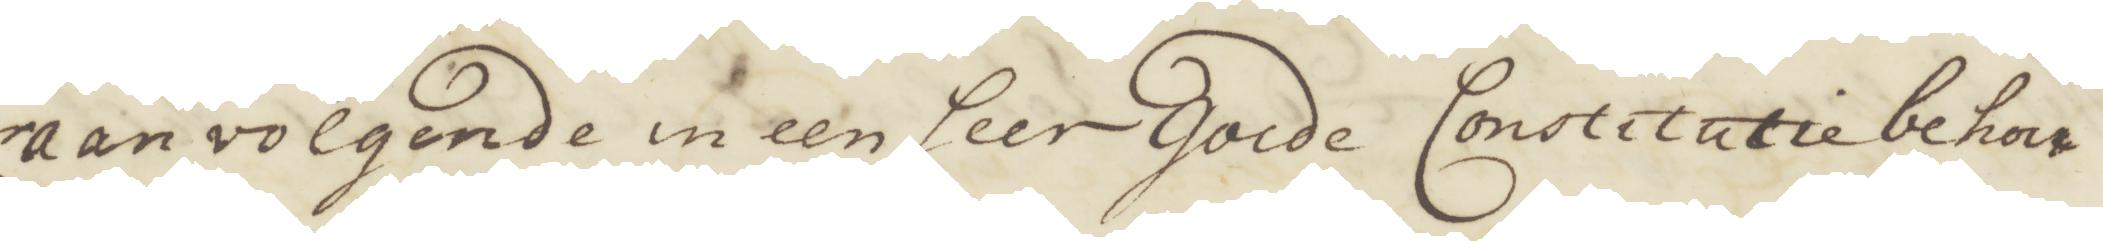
aan volgende in een seer goede Constitutie behou
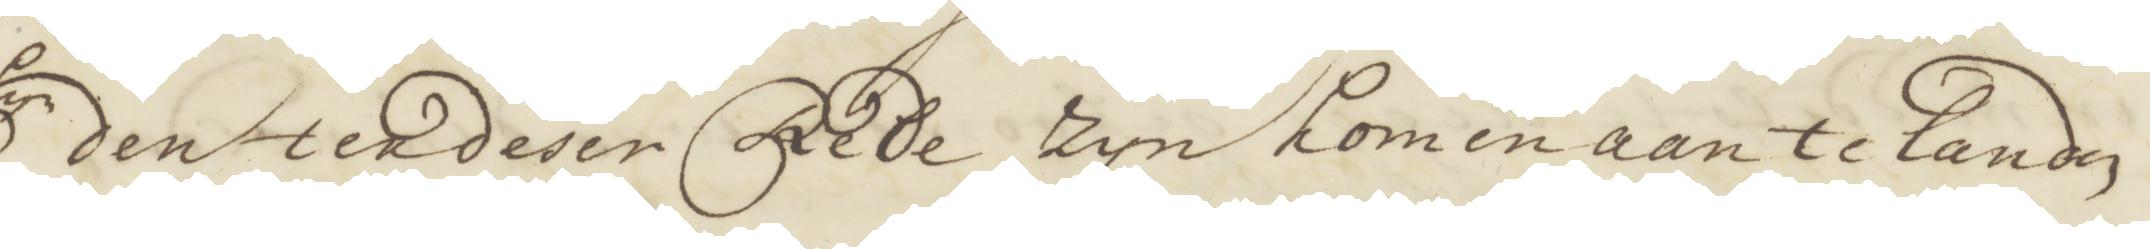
den ter deser Rede zyn komen aan te landen
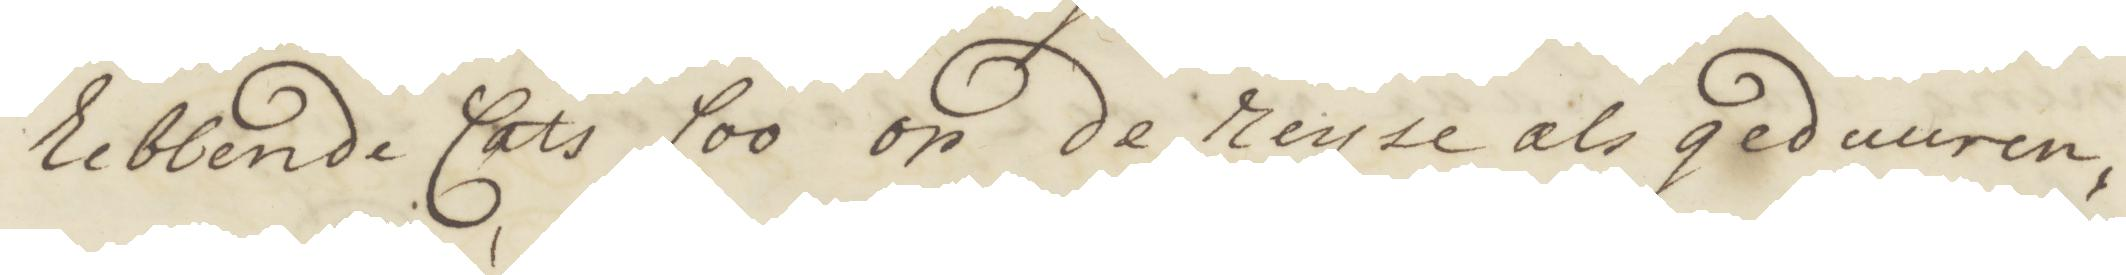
hebbende Cats soo op de reyse als geduuren„
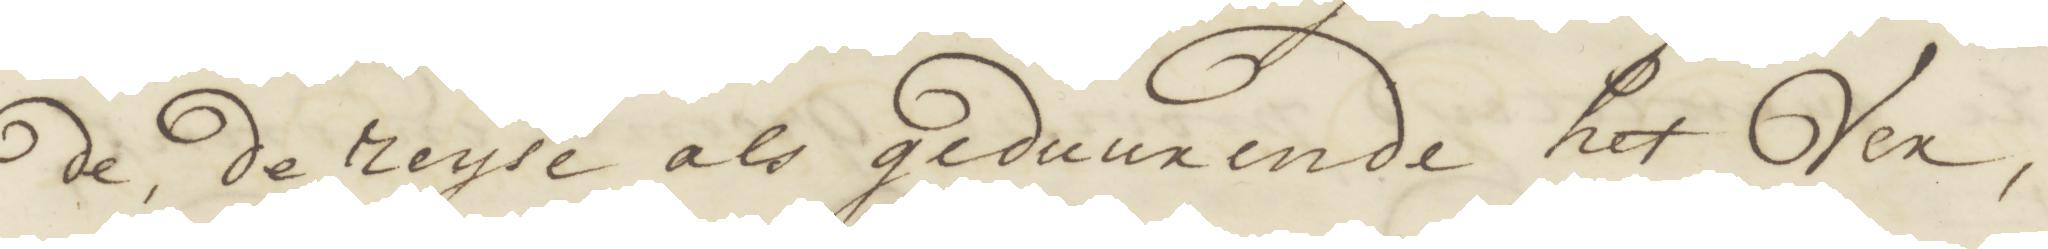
de, de reyse als geduurende het ver,
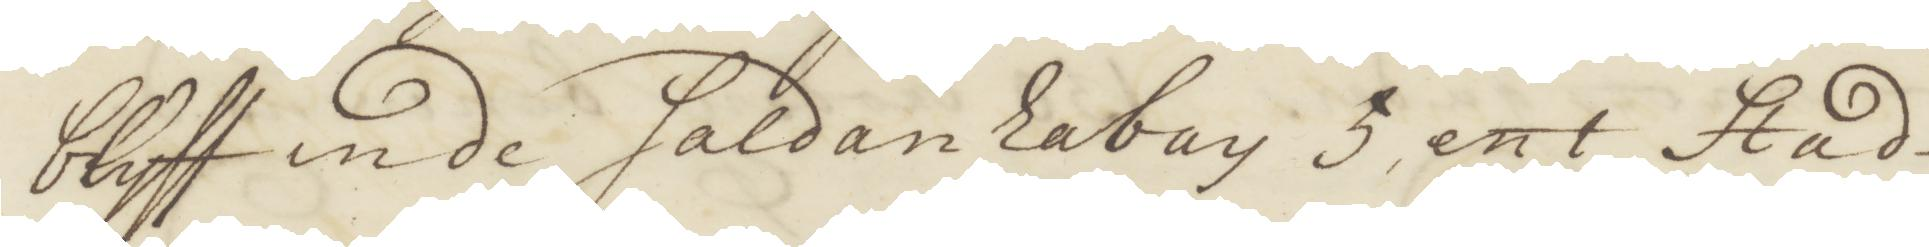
blyff in de saldan habay 5, en’t stad
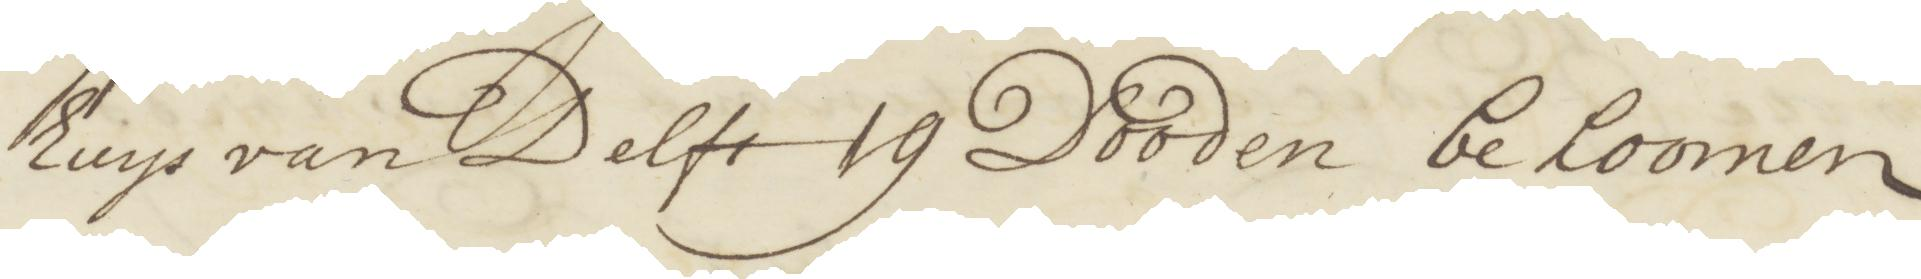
huys van Delft 19 Dooden bekoomen
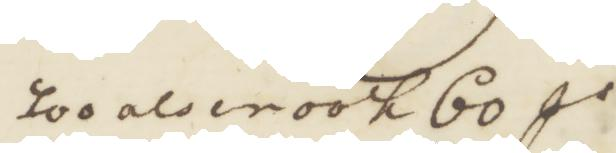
zoo als en ook 60 ps
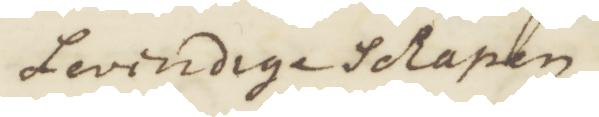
levindige schapen
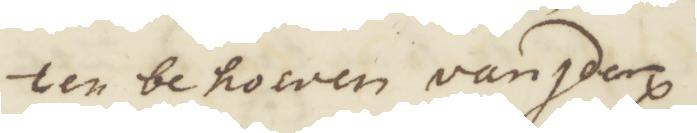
ten behoeven van jder
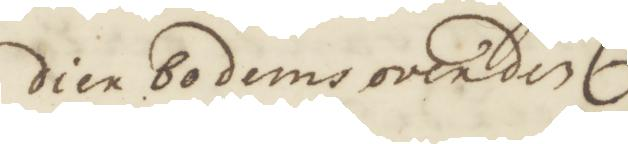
dier bodems over den
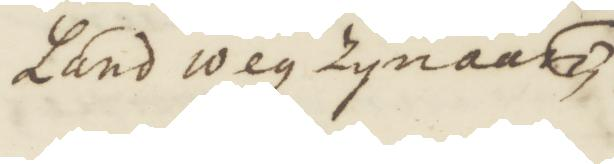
Land weg zyn aan,
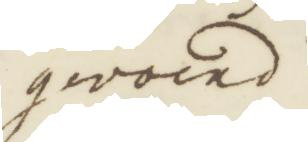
gevoerd
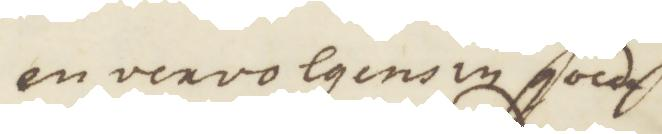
en vervolgens in goede
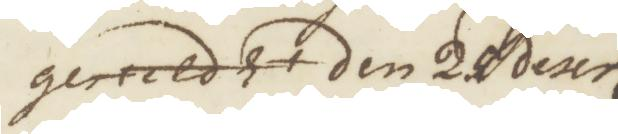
gesteldht den 25 deser
